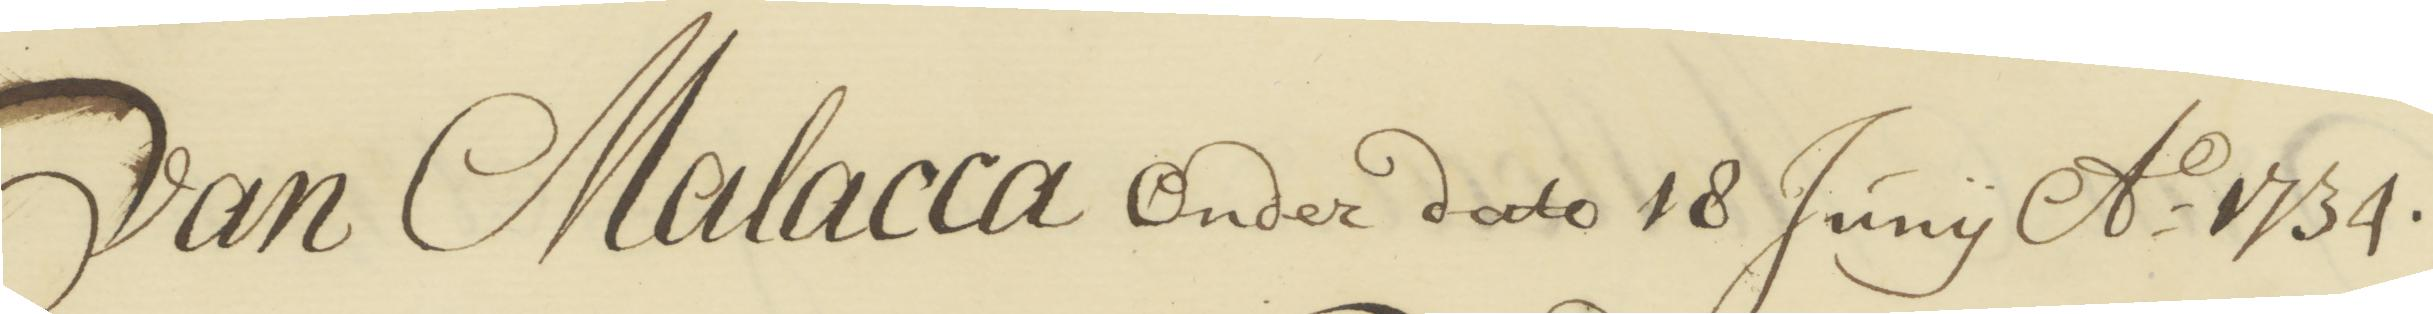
van Malacca Onder dato 18 Junij A:o 1734.
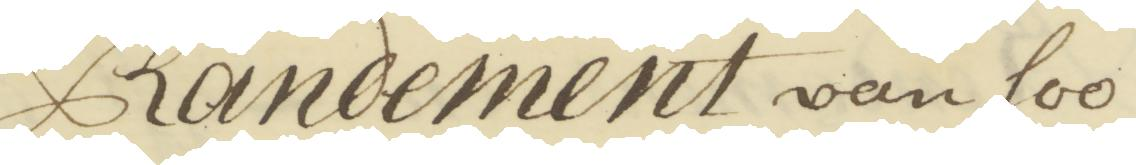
Randement van soo
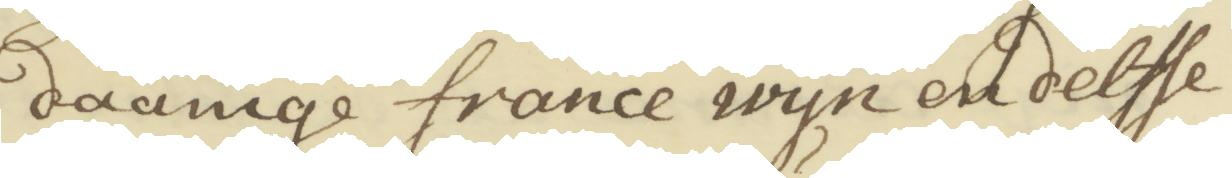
daanige france wijn en delfse
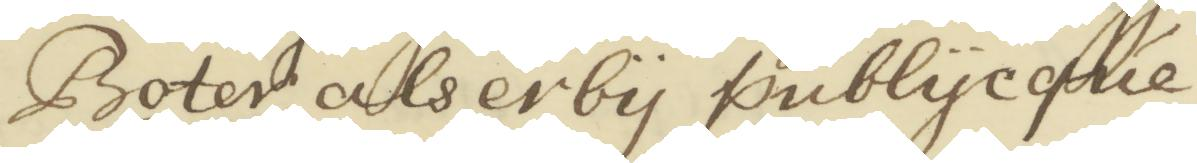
Boter als erbij publijcque
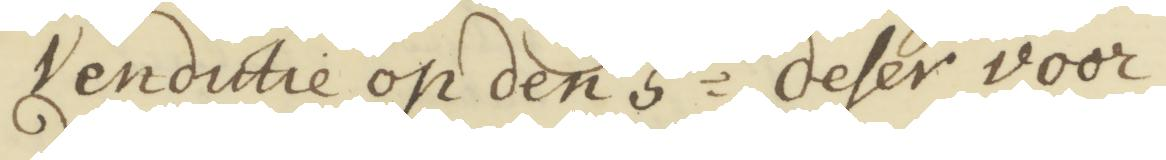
Vendutie op den 5=en deser voor
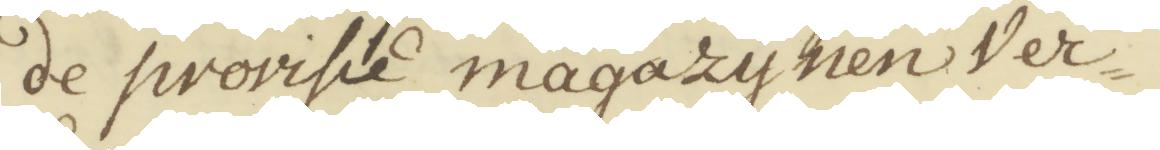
de provisie magazijnen Ver„
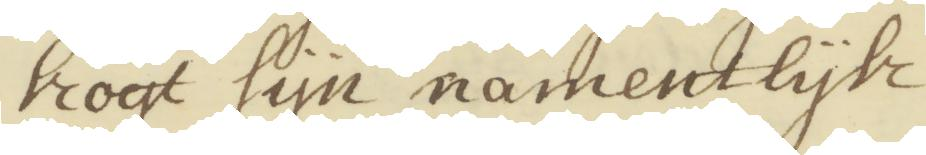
kogt sijn namentlijk
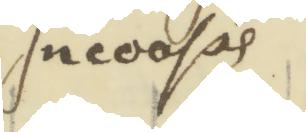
Incoopen
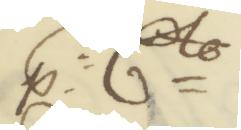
p:r C=to
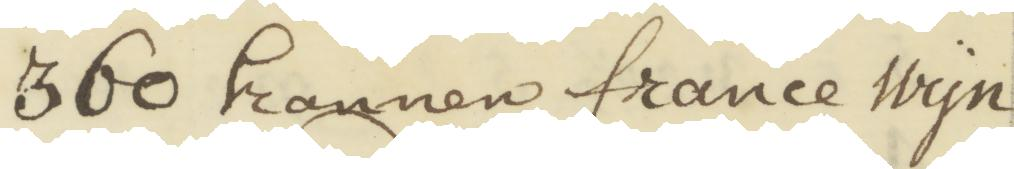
360 kannen france wijn
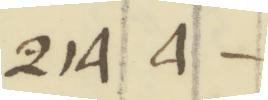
214 4 -
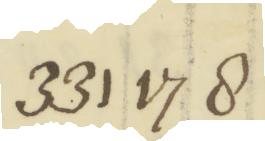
311 17 8
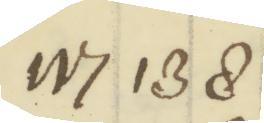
117 13 8
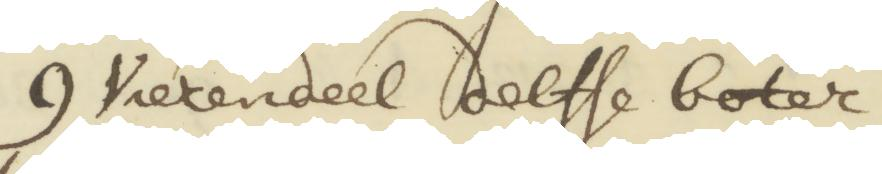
9 Vierendeel delfse boter
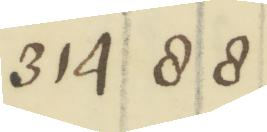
314 8 8
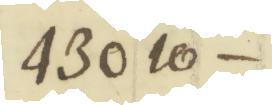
430 10 -
